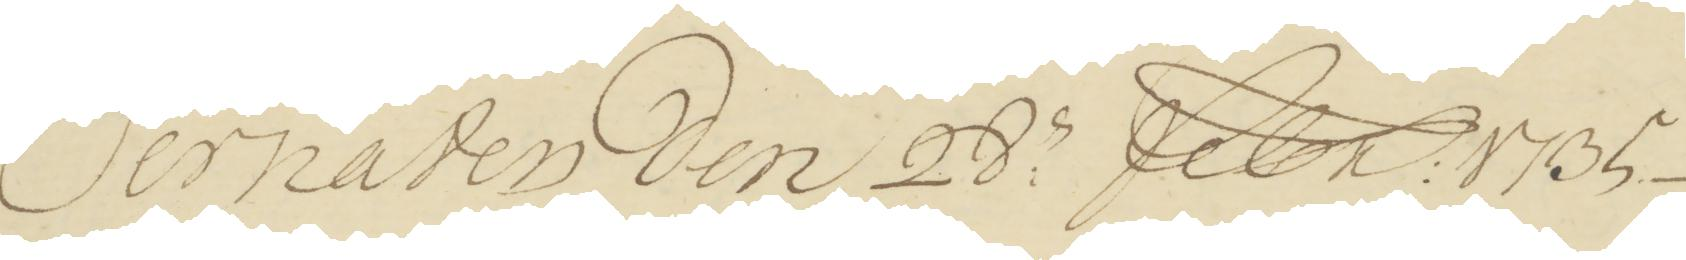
Ternaten den 28:en febr: 1735.
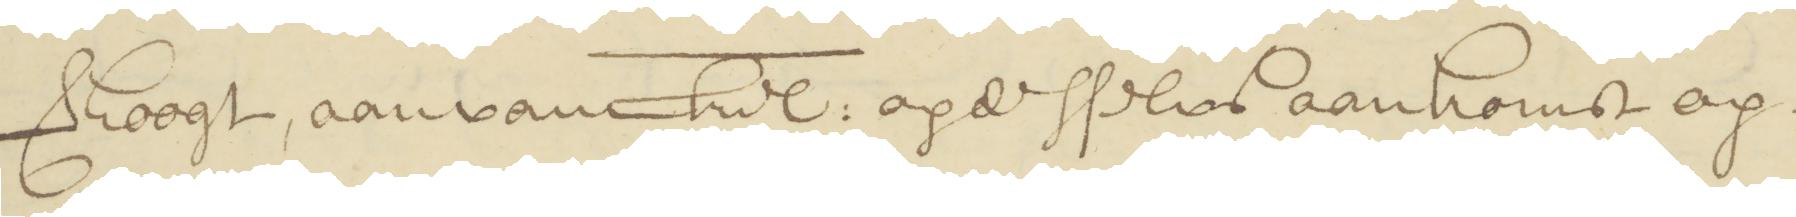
Verhoogt, aanvanckelijk op desselvs aankomst op
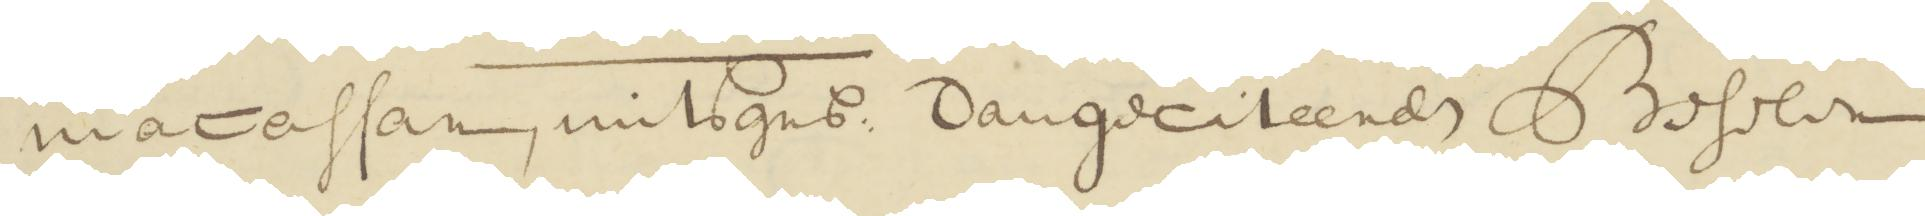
macassar, mitsgrs: Dan geciteerden Beseler
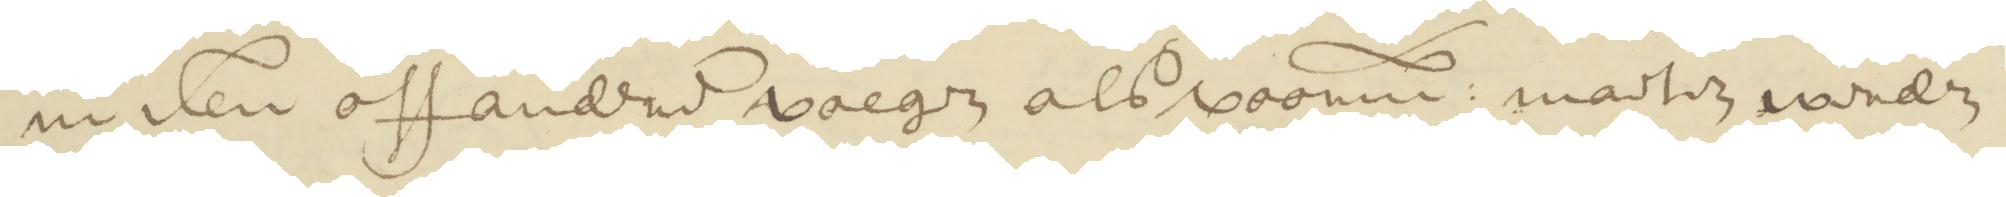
in Een off andere voegen als voorm: moeten werden
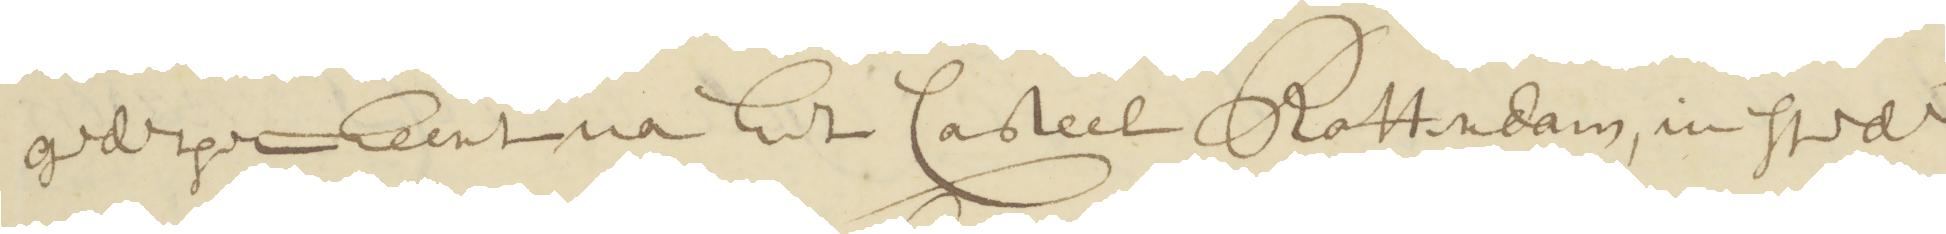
gedepecheert na het Casteel Rotterdam, in stede
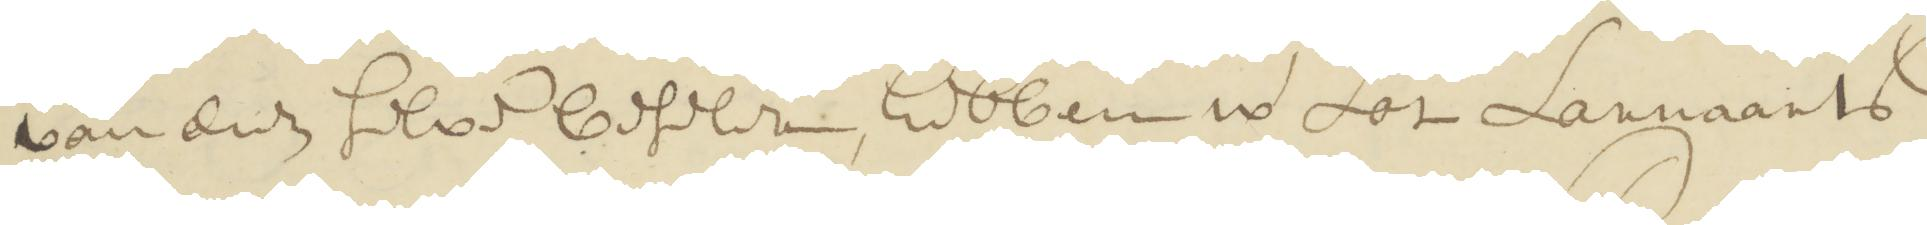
van dien selve beseler, hebben w'Tot Tarnaarts
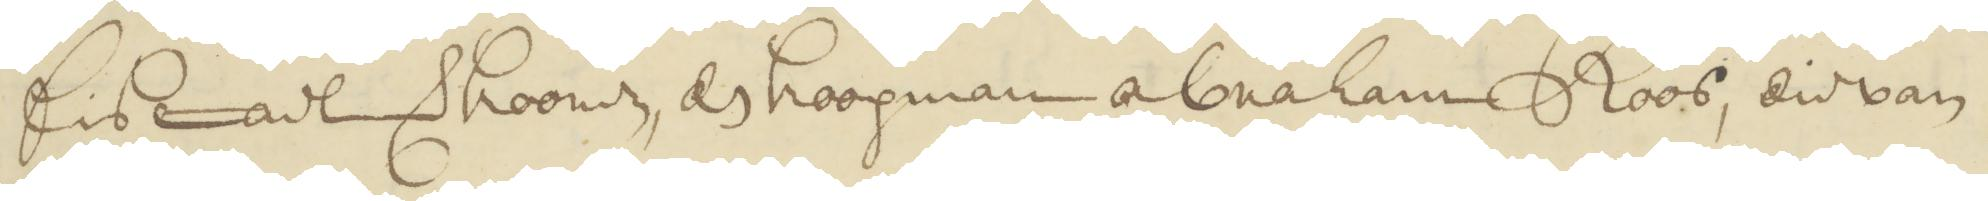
fiscael verkooren, den koopman abraham Roos, die van
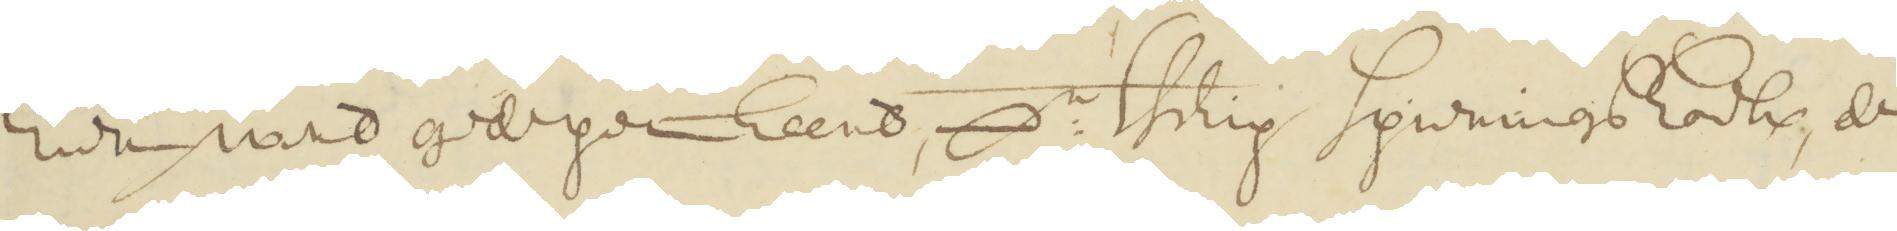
hier werd gedepecheerd, p:r 't schip Spieringshoek, de
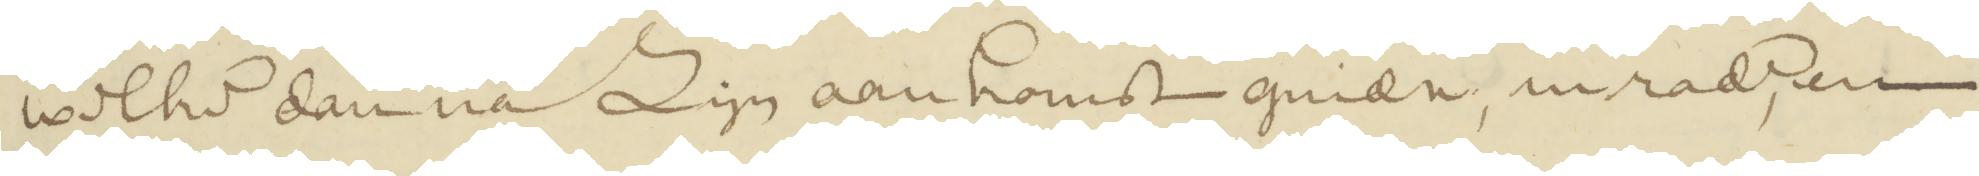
welke dan na Zijn aankomst ginder, in rade, en
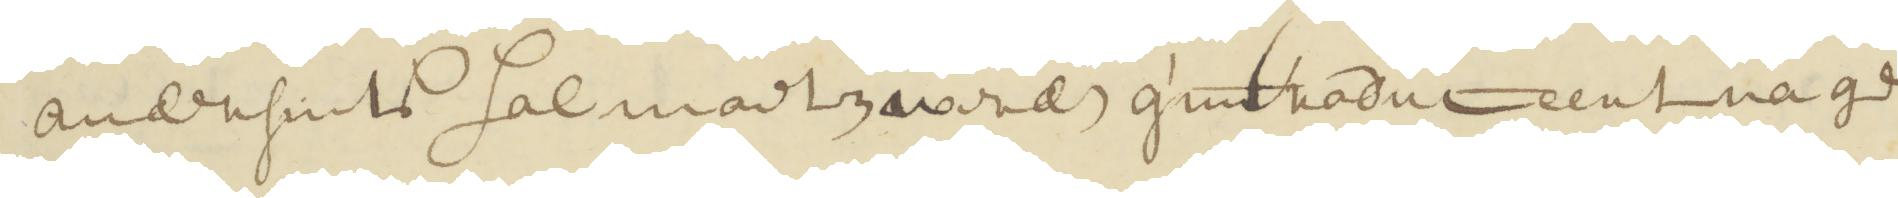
andersints Sal moeten werden g'introduceert na ge
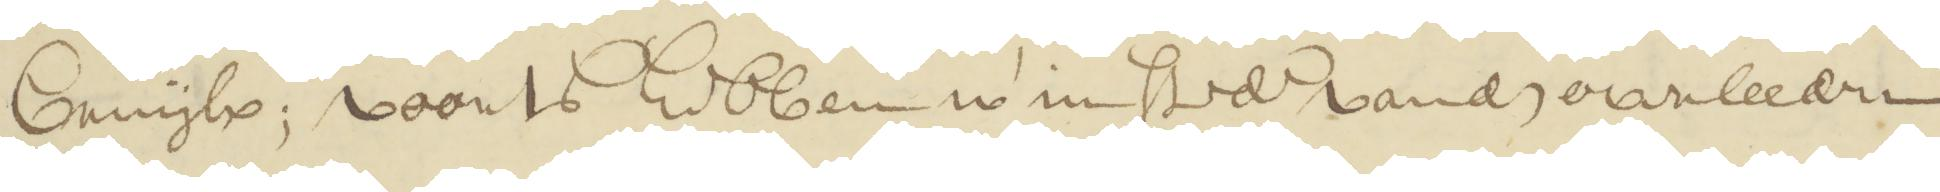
bruijk; voorts hebben w' in Stede van den overleeden
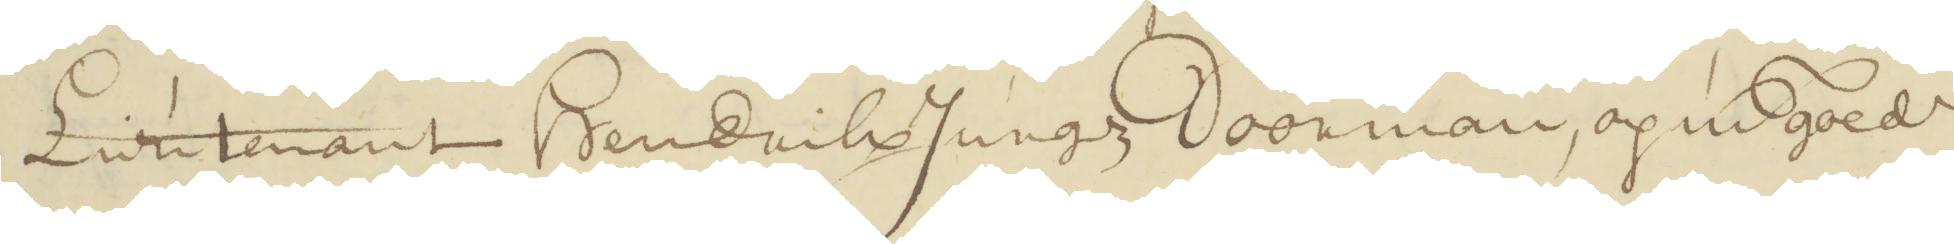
Lieutenant Hendrik Jurgen Doorman, op uE goede
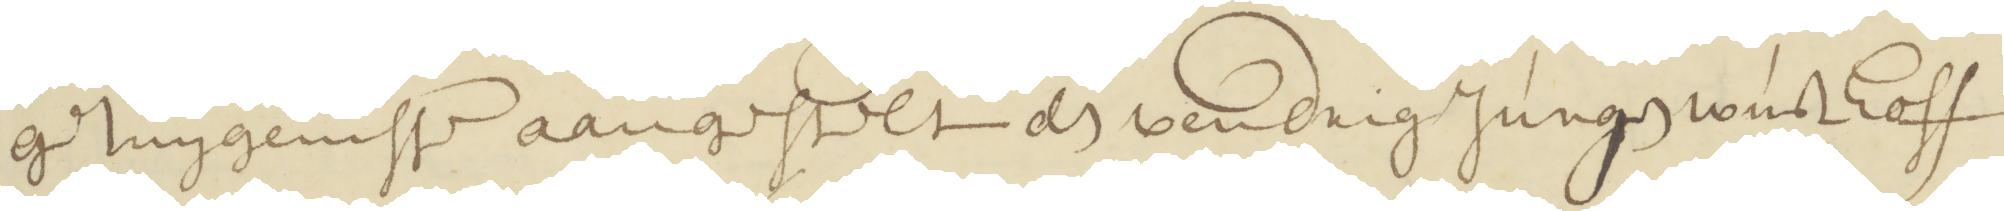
getuijgenisse aangestelt den vendrig Jurgen wusthoff
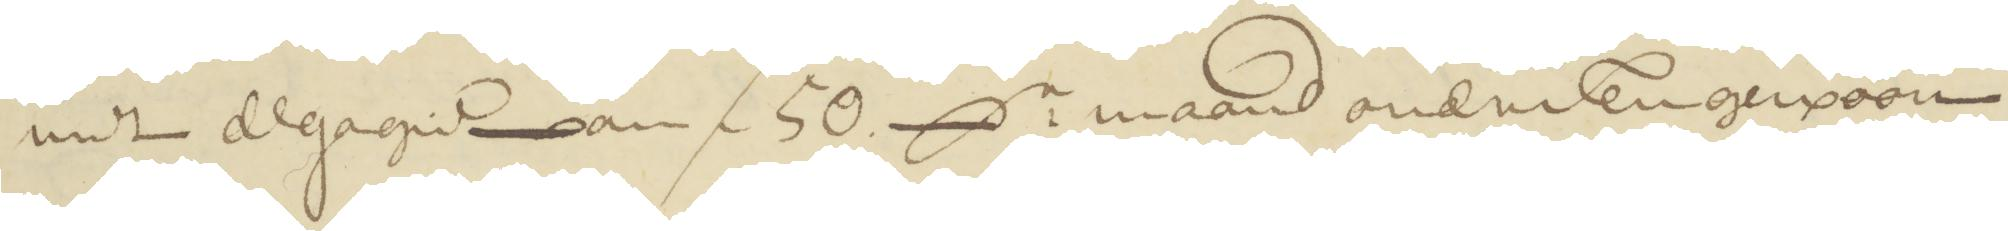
met de gagie van ƒ 50. p:r maand onder Een gewoon
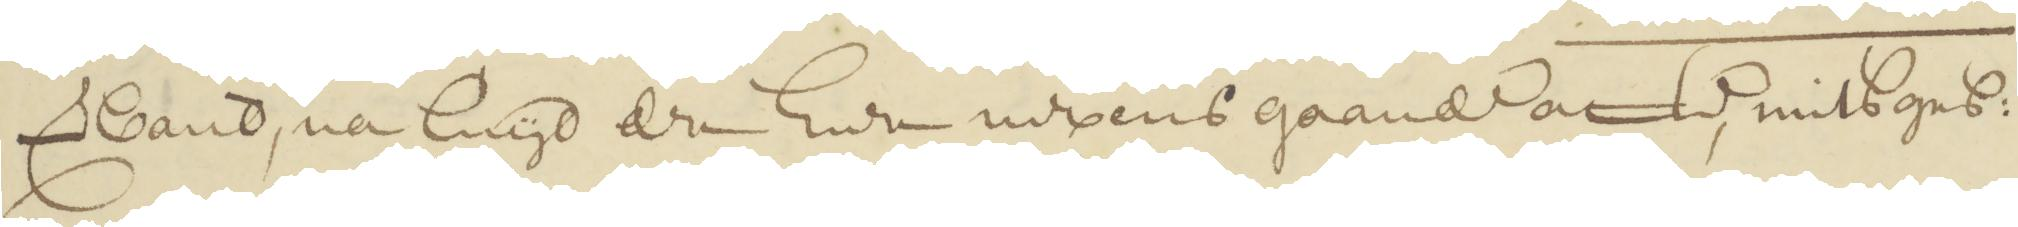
verband, na luijd der hier nevens gaande acte, mitsgrs:
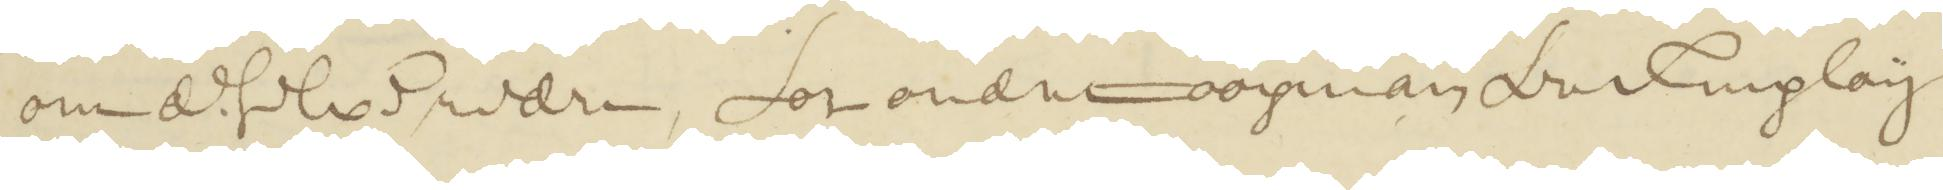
om deselve reden, tot onder coopman ter Emploij
